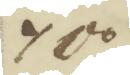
7 do
